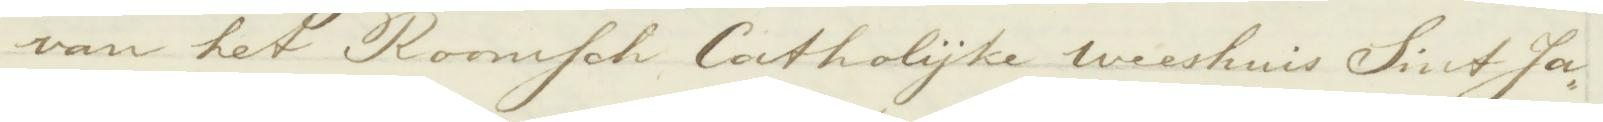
van het Roomsch Catholijke weeshuis Sint Ja„
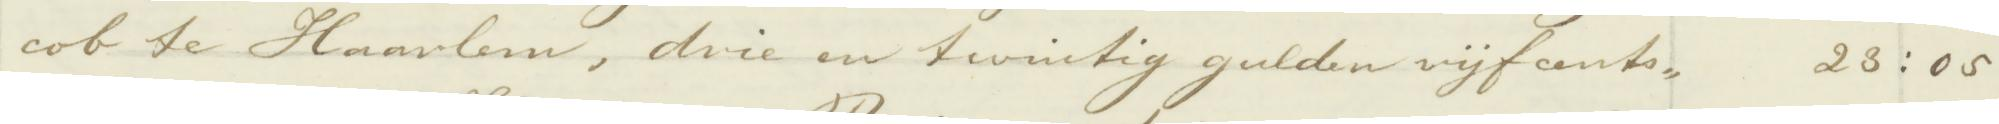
cob te Haarlem, drie en twintig gulden vijf cents „ 23: 05
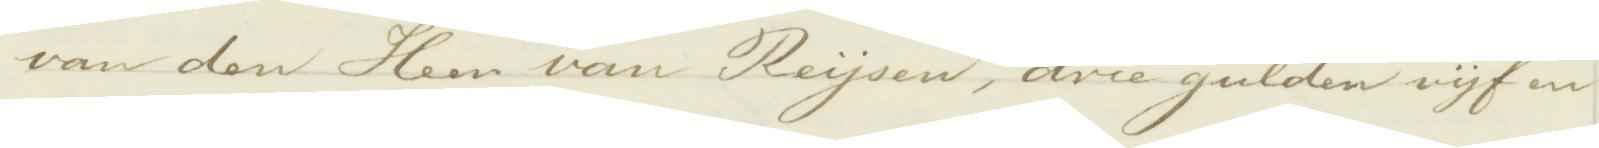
van den Heer van Reijsen, drie gulden vijf en
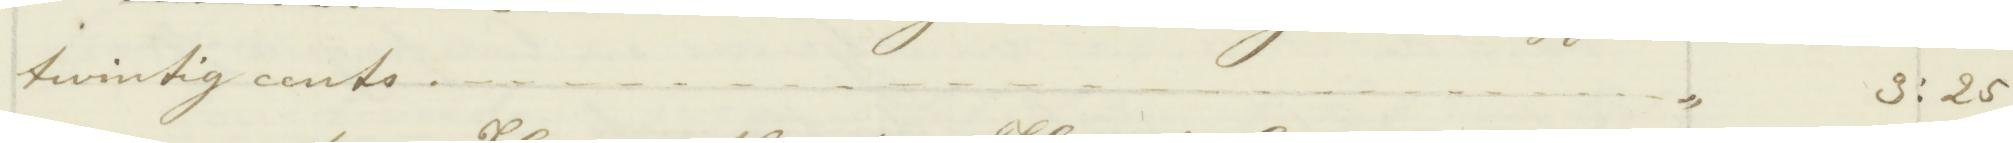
twintig cents. - - - - - - - - - - - - - - - - - - - - - - - - - „ 3: 25
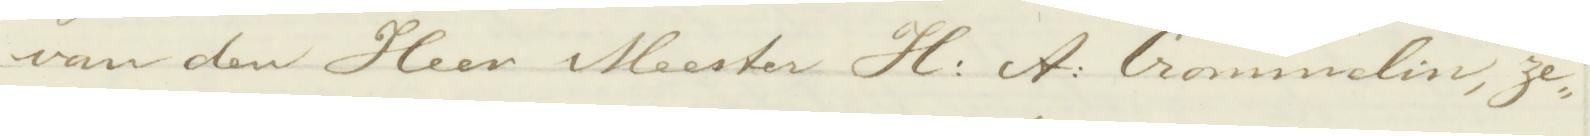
van den Heer Meester H: A: Crommelin, ze„
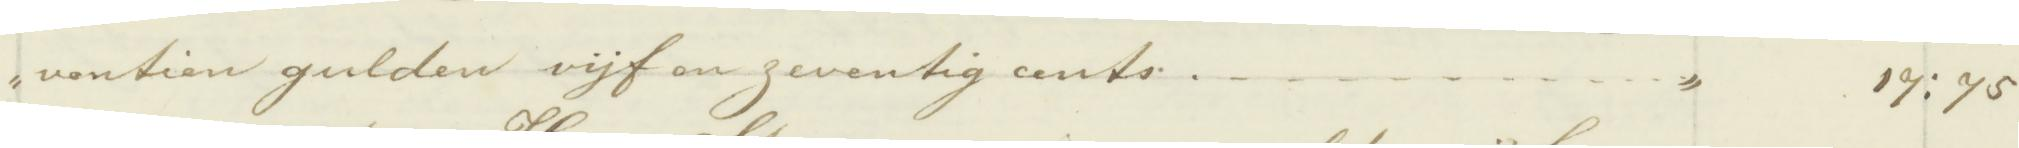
„ventien gulden vijf en zeventig cents. - - - - - - - - - - -„ 17: 75
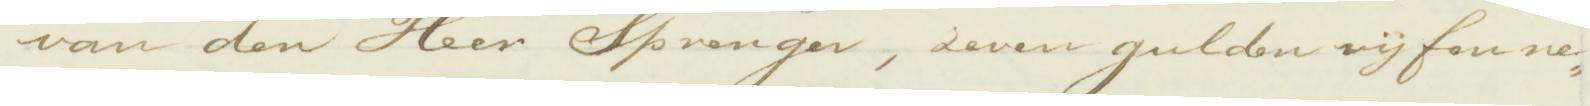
van den Heer Sprenger, zeven gulden vijfen ne„
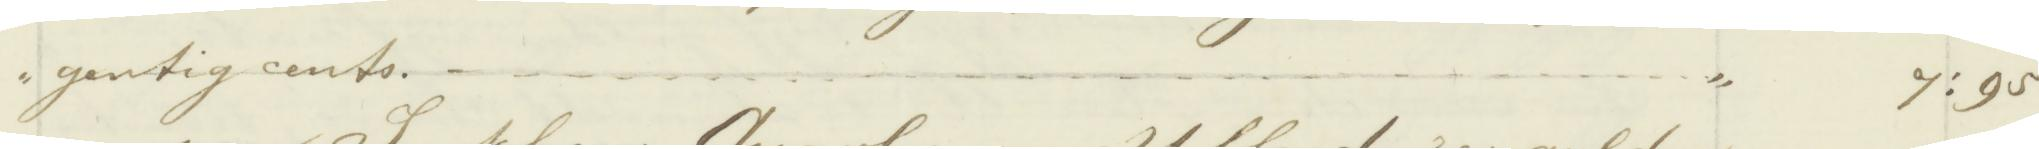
„gentig cents. - - - - - - - - - - - - - - - - - - - - - - - - - - - -„ 7: 95
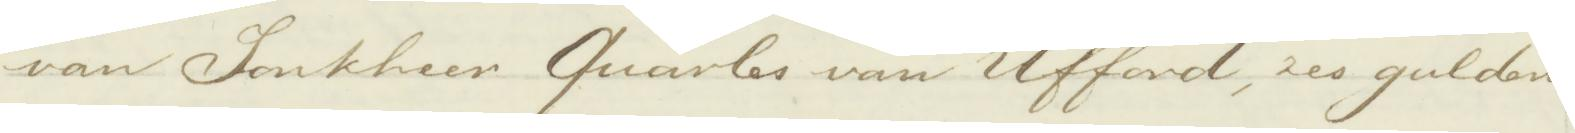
van Ionkheer Quarles van Ufford, zes gulden
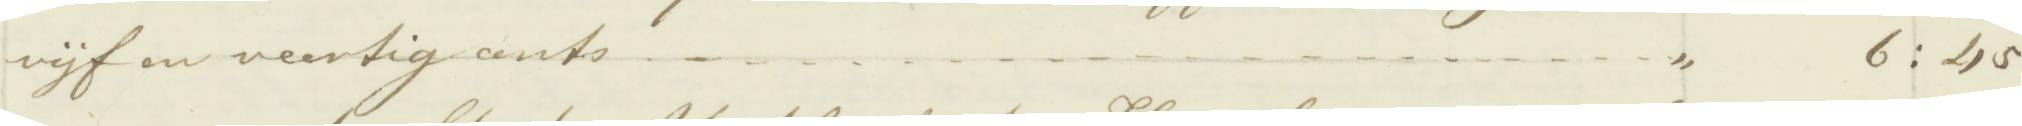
vijf en veertig cents . - - - - - - - - - - - - - - - - - - - - - .„ 6: 45
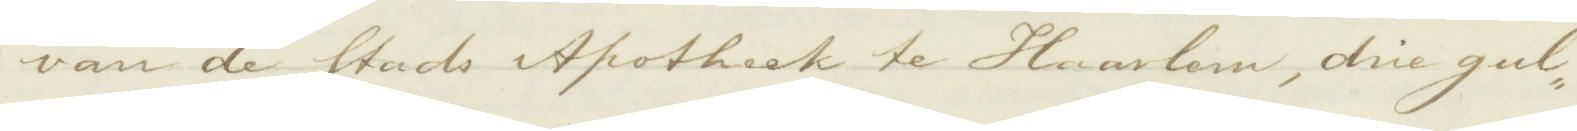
van de stads Apotheek te Haarlem, drie gul„
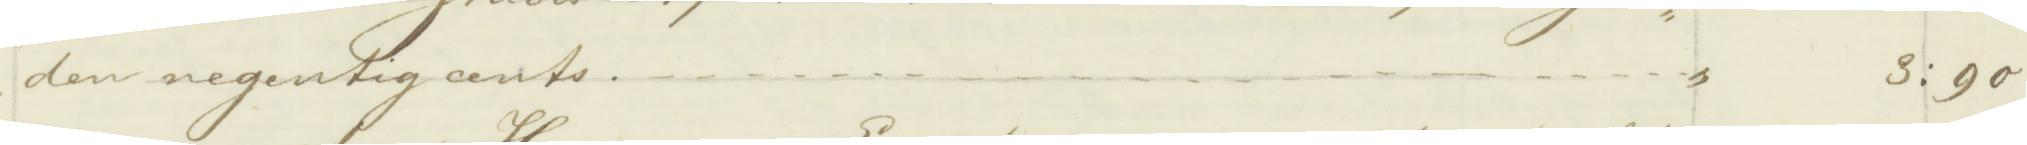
den negentig cents. - - - - - - - - - - - - - - - - - - - - - - - „ 3. 90
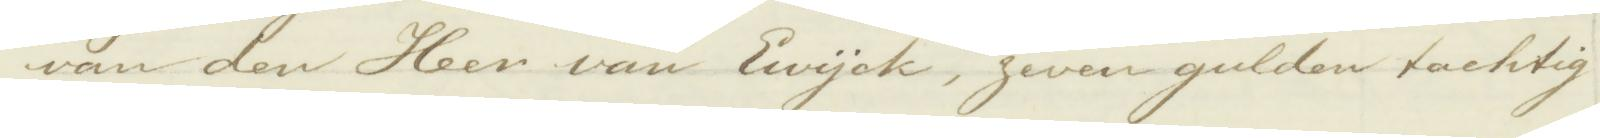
van den Heer van Ewijck, zeven gulden tachtig
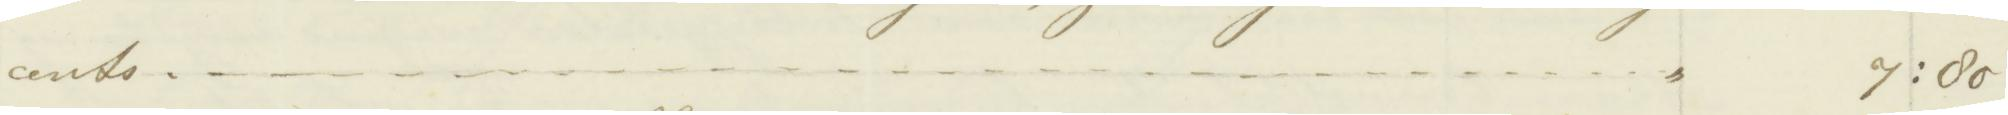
cents . - - - - - - - - - - - - - - - - - - - - - - - - - - - - - -„ 7: 80
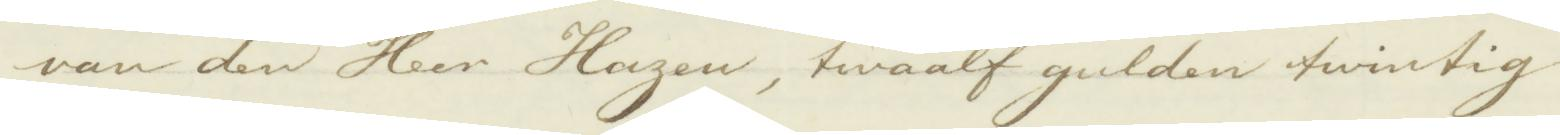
van den Heer Hazen, twaalf gulden twintig
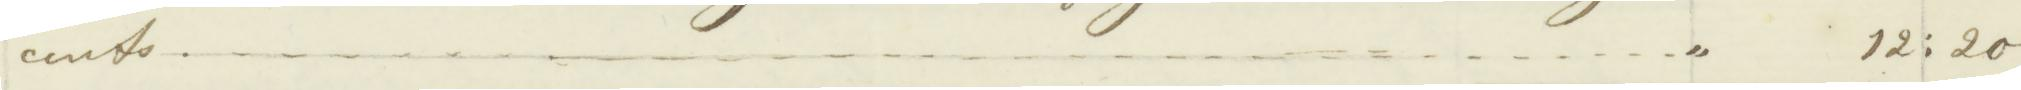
cents . - - - - - - - - - - - - - - - - - - - - - - - - - - - - - - „ 12: 20
